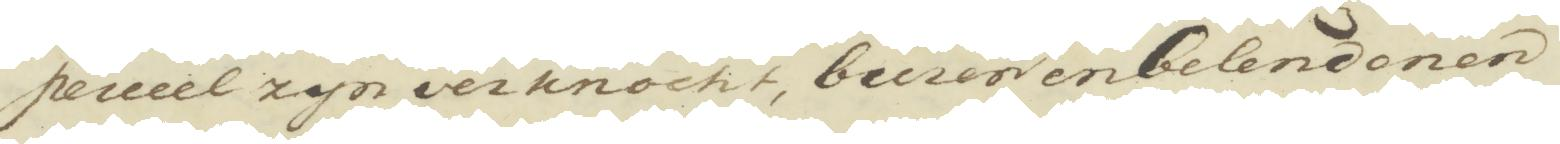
perceel zyn verknocht, buren en belenden en
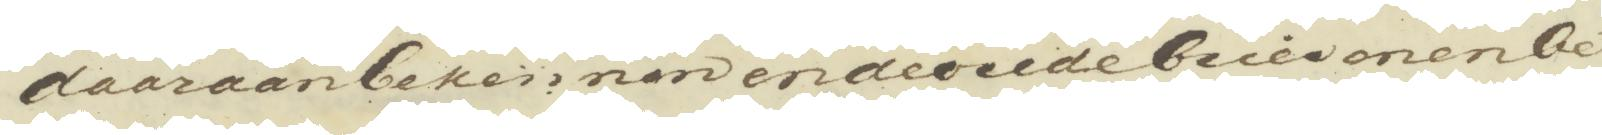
daaraan bekennen en de oude brievenen be
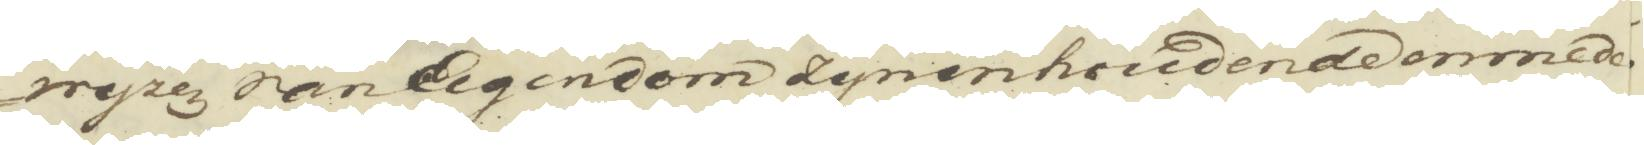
wyzen van Eigendom zynen houdende enmede
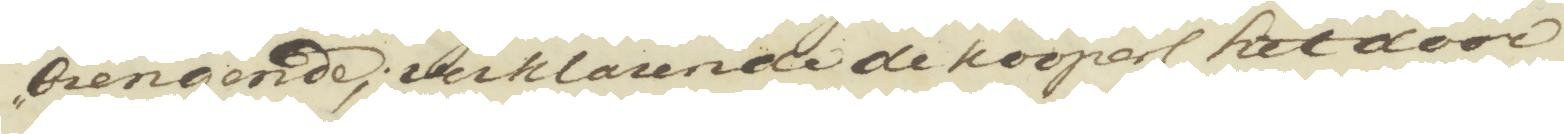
„brengende, verklarende de koopers het door
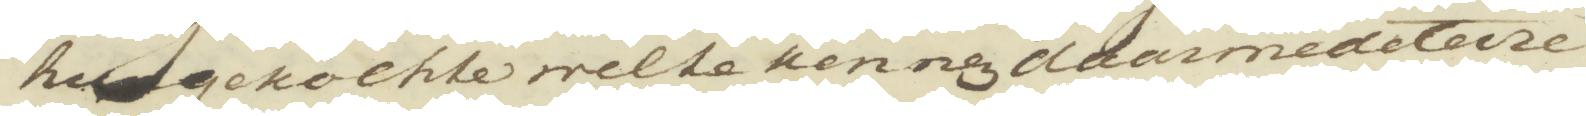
hun gekochte wel te kennen daarmede tevre
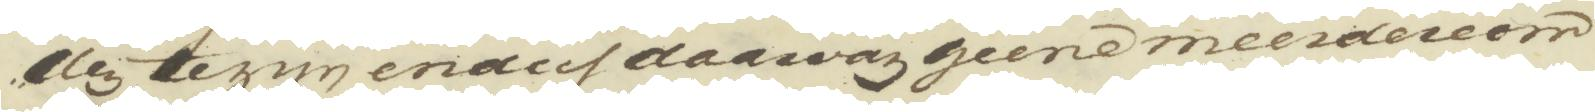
„den tezijn endus daarvan geene meerdereom
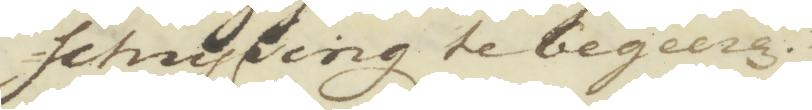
=schryving te begeeren.
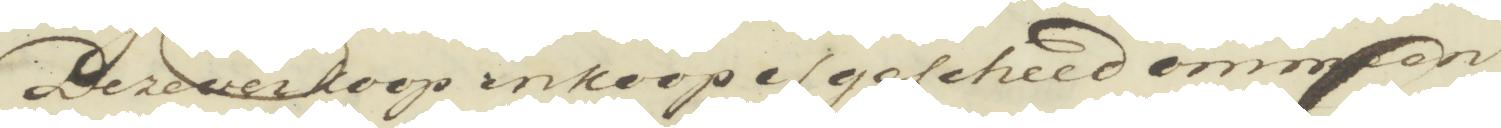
Dezeverkoop enkoop is geschied omme en
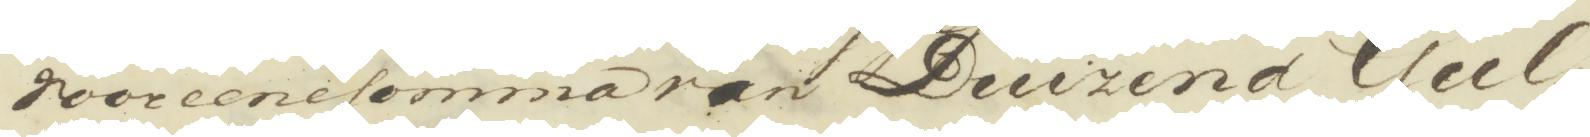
voor eene somma van Duizend Gul
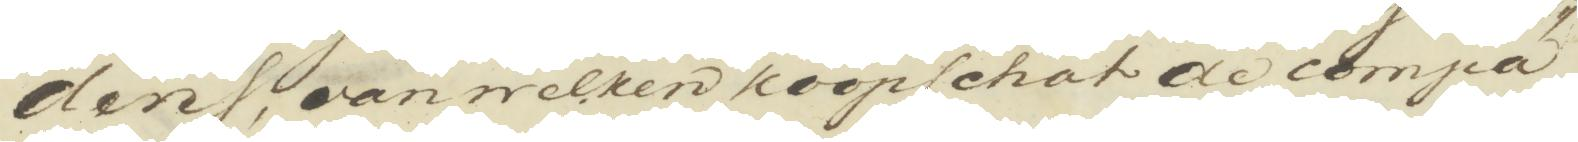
dens, van welken koopschat de compa
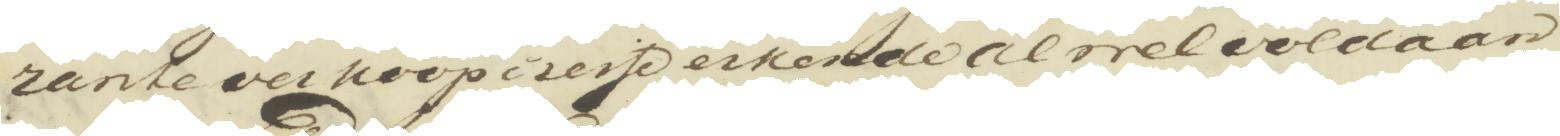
rante verkooperesse erkende al wel voldaan
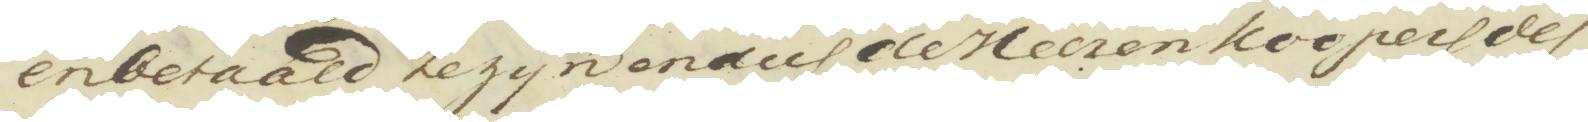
enbetaald tezyn endus de Heeren koopers des
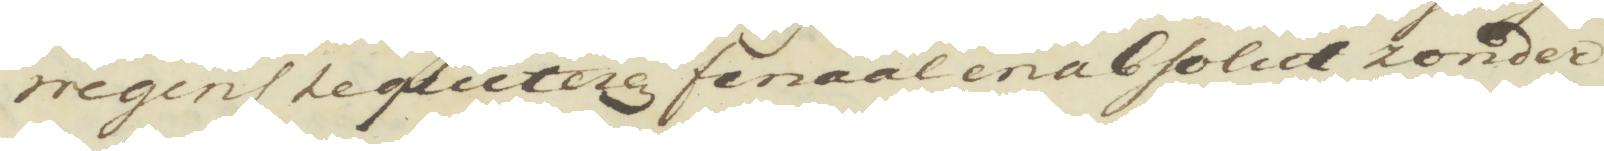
wegens te quiteren finaal en absolut zonder
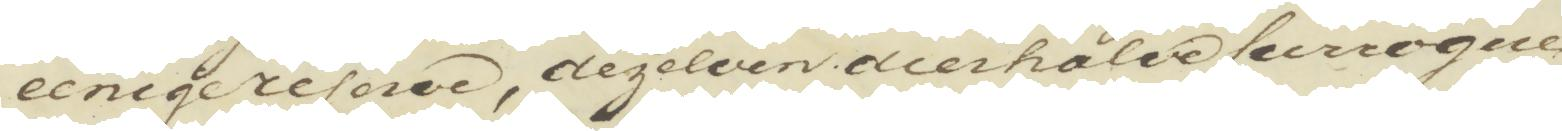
eenige reserve, dezelven dierhalve surrogeren
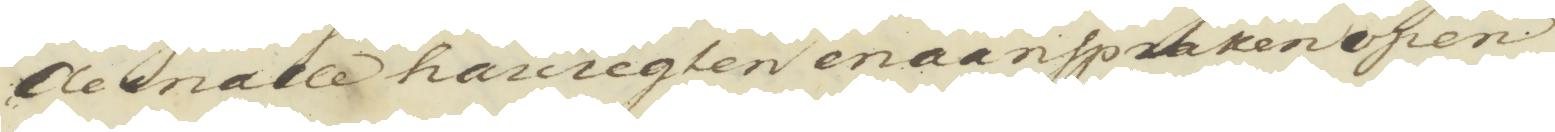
„de in alle hare regten en aanspraken op en
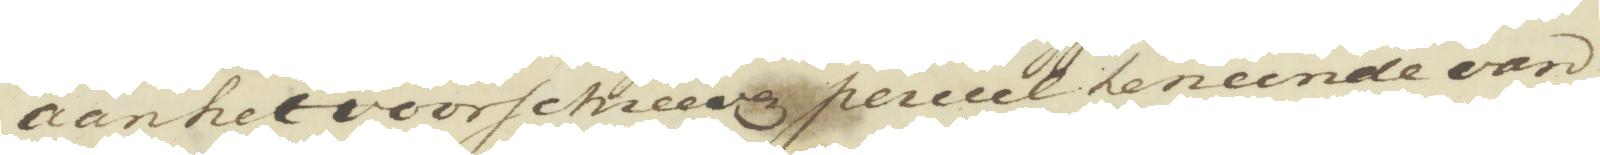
aan het voorschreeven perceel ten einde van
